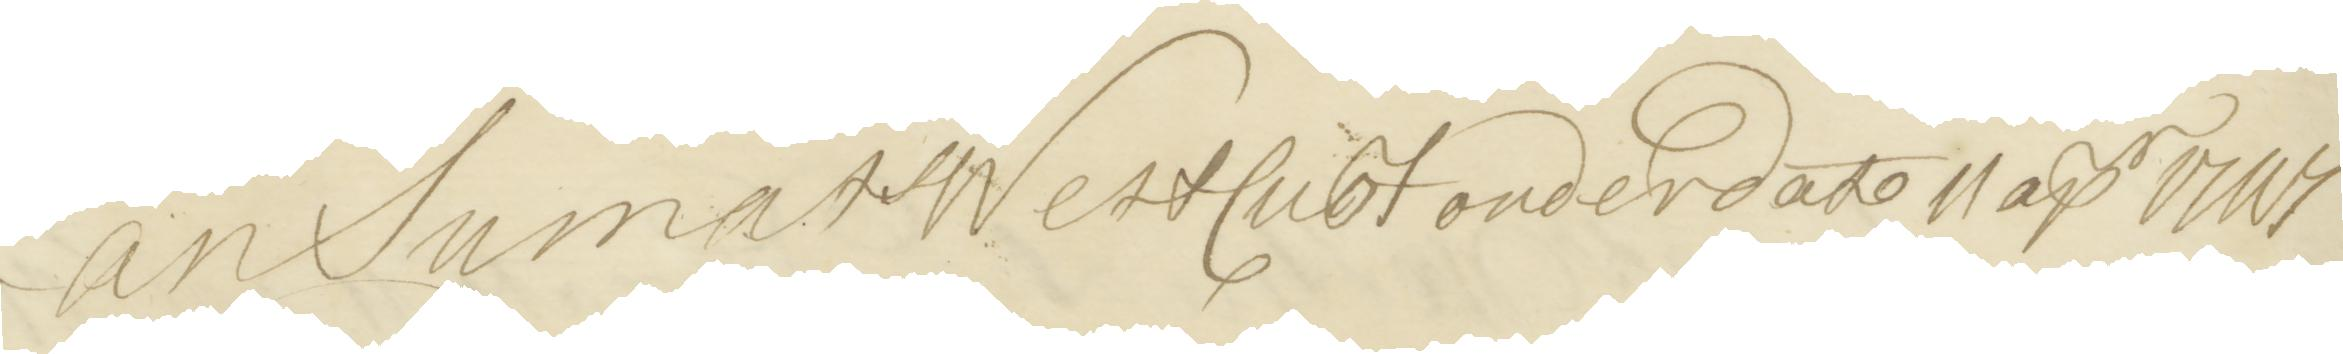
Van Sumats West Cust onder dato 11 apr 1747
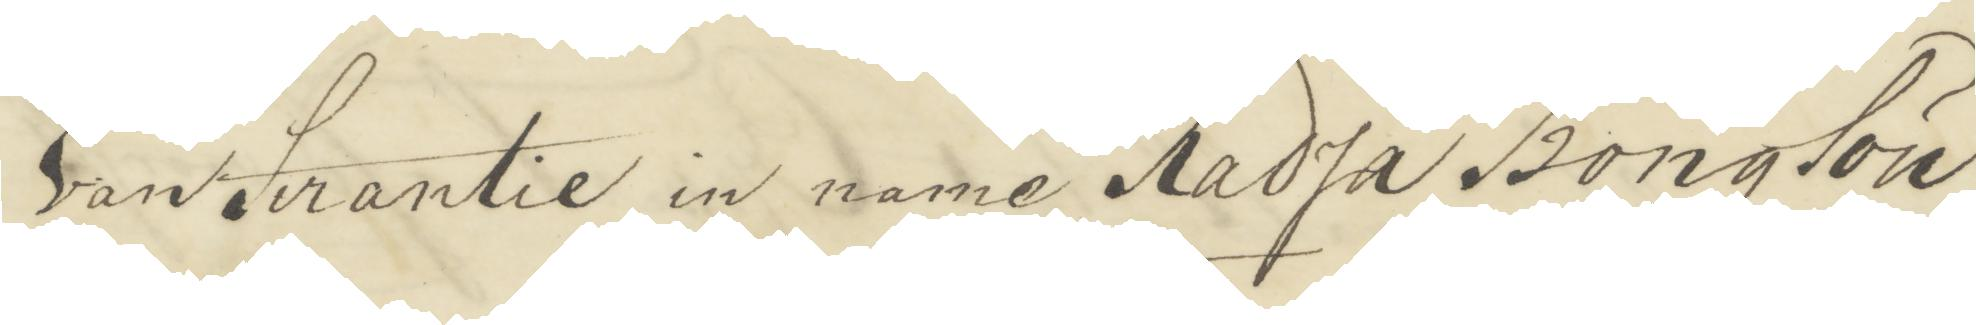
Van Sirantie in name Radja Bongsou
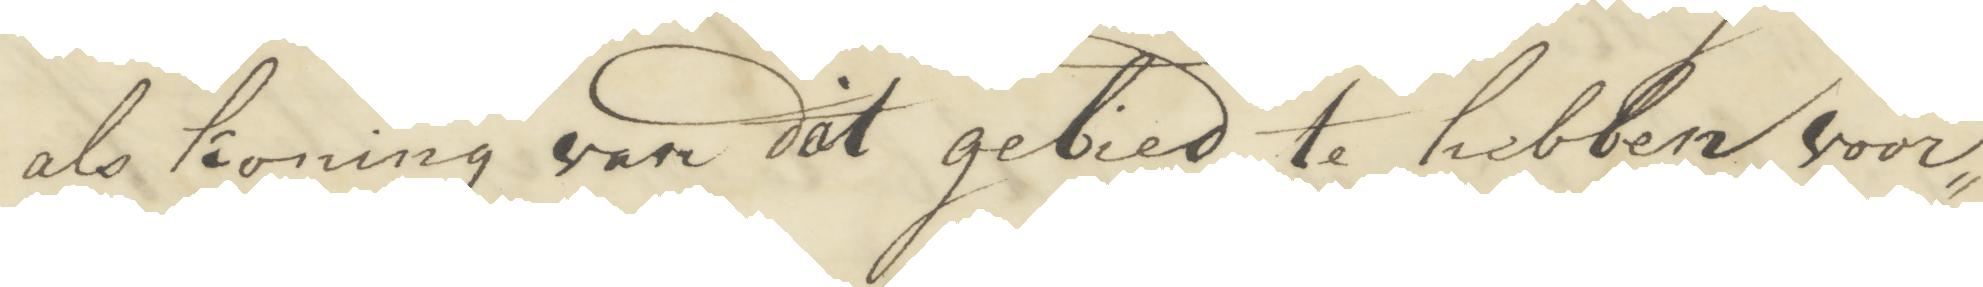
als koning van dat gebied te hebben voor„
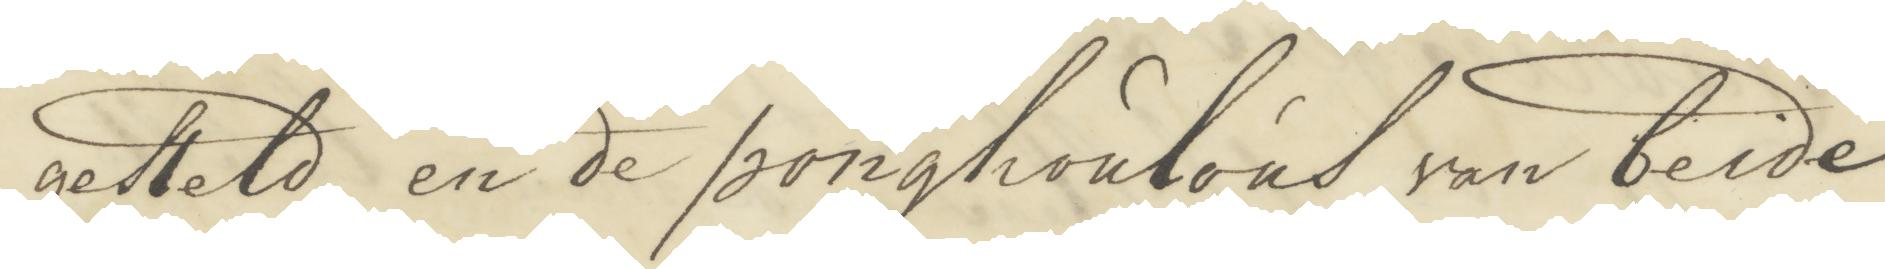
gesteld, en de ponghoulous van beide
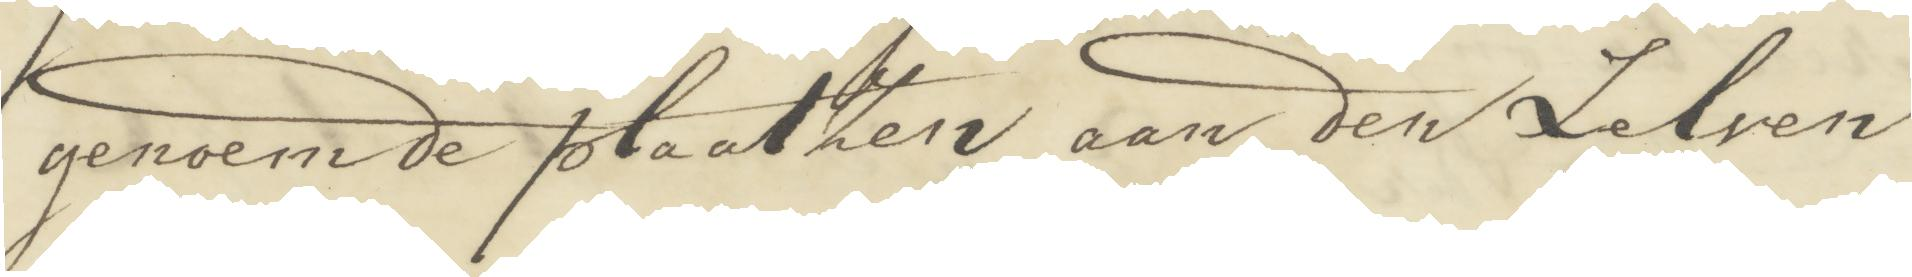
genoemde plaatzen, aan den zelven
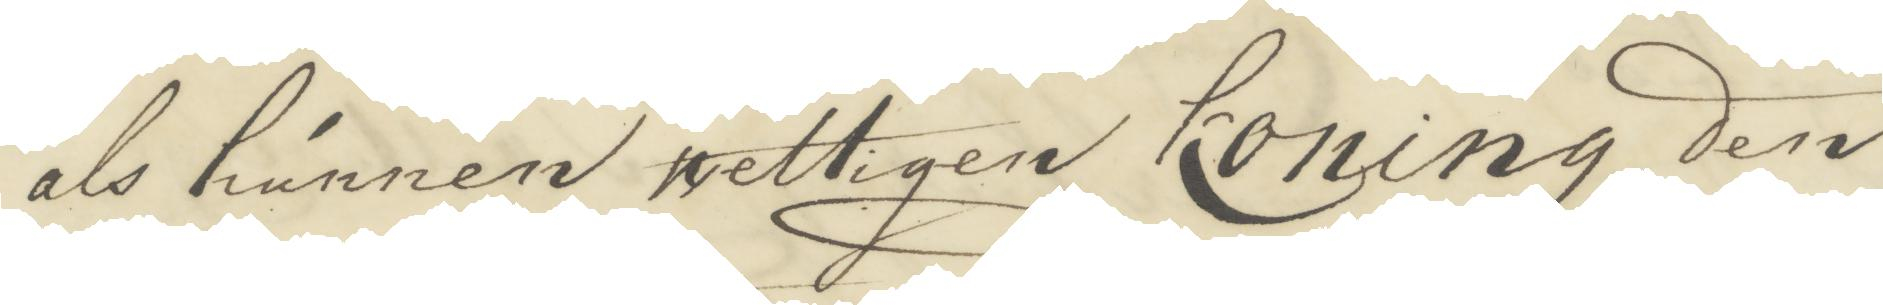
als hunnen wettigen Koning den
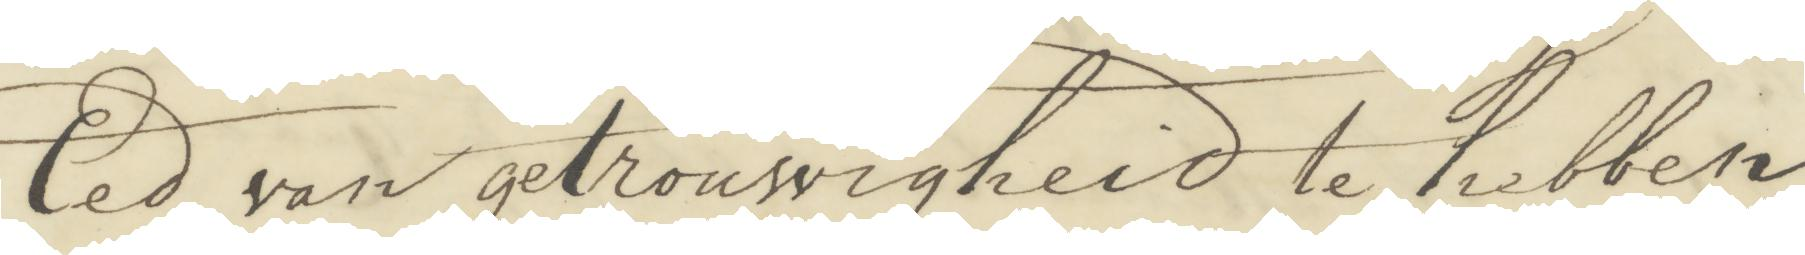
Eed van getrouwigheid te hebben
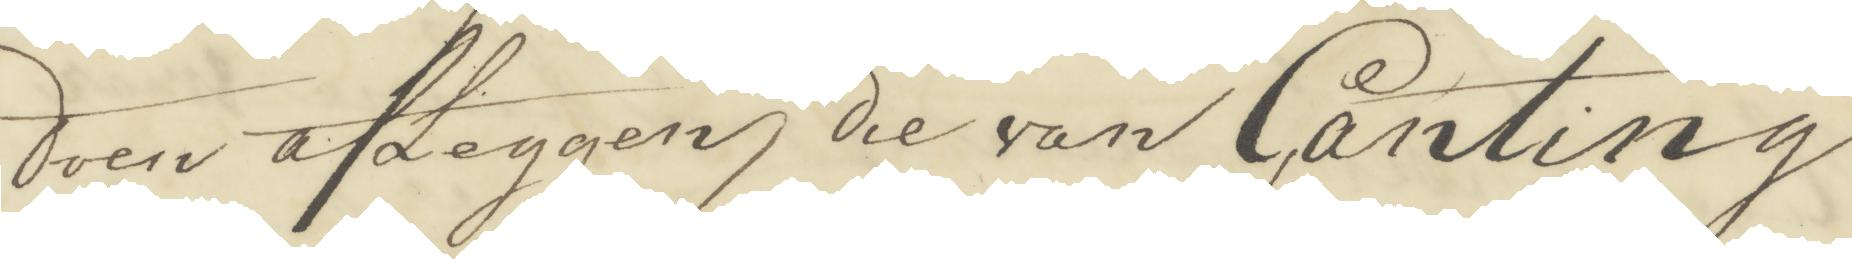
doen afleggen, die van Ganting
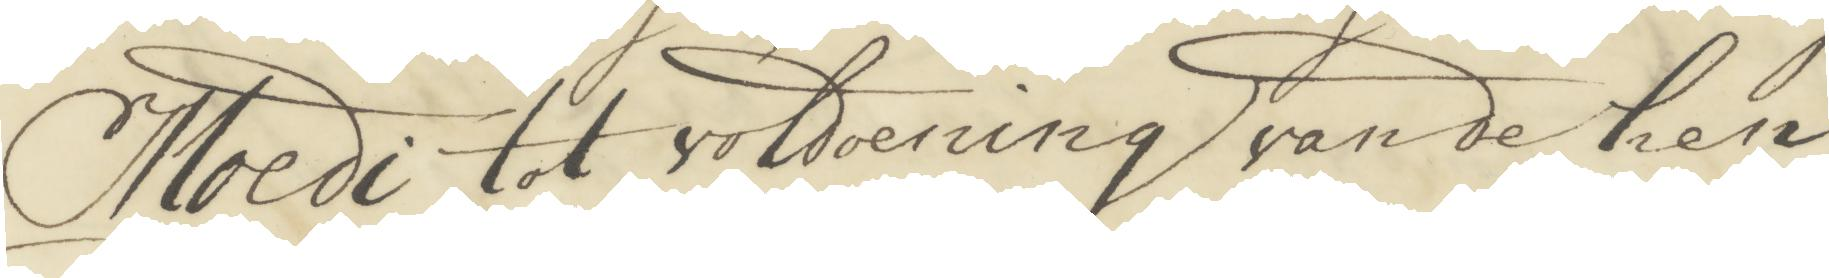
Moedi tot voldoening van de hen
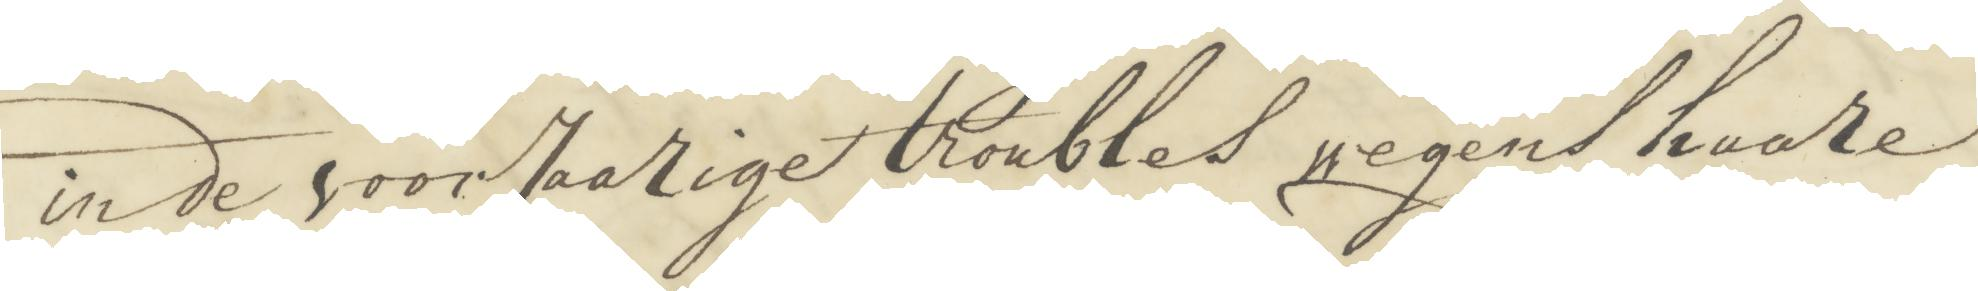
in de voorjarige troubles wegens haare
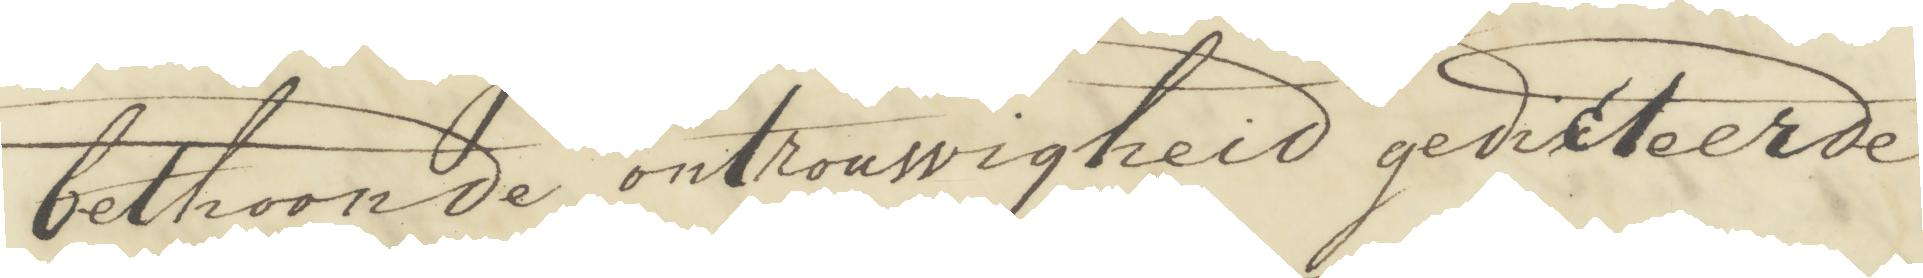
bethoonde ontrouwigheid gedicteerde
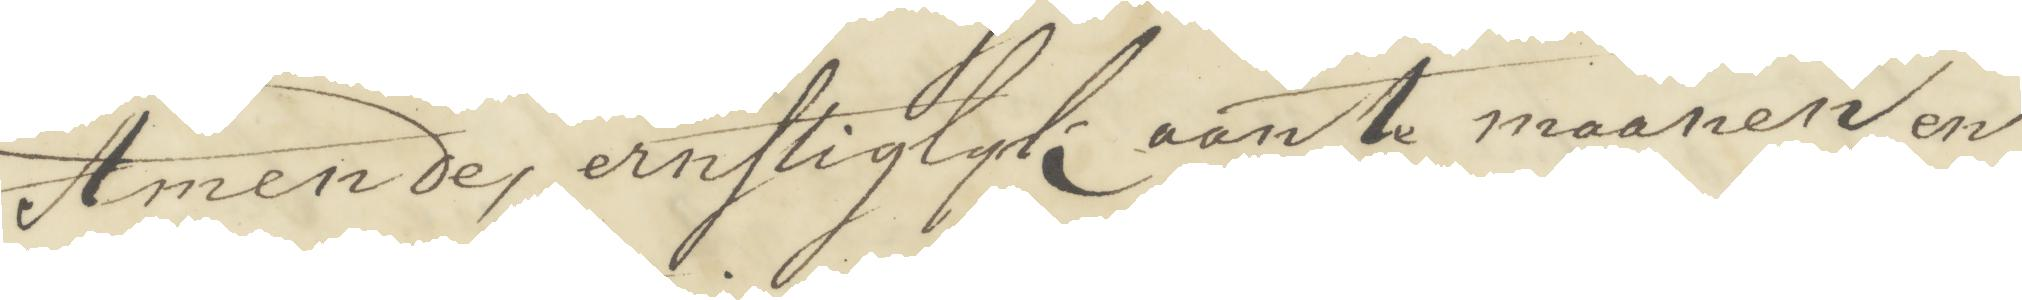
Amende, ernstiglyk aan te maanen, en
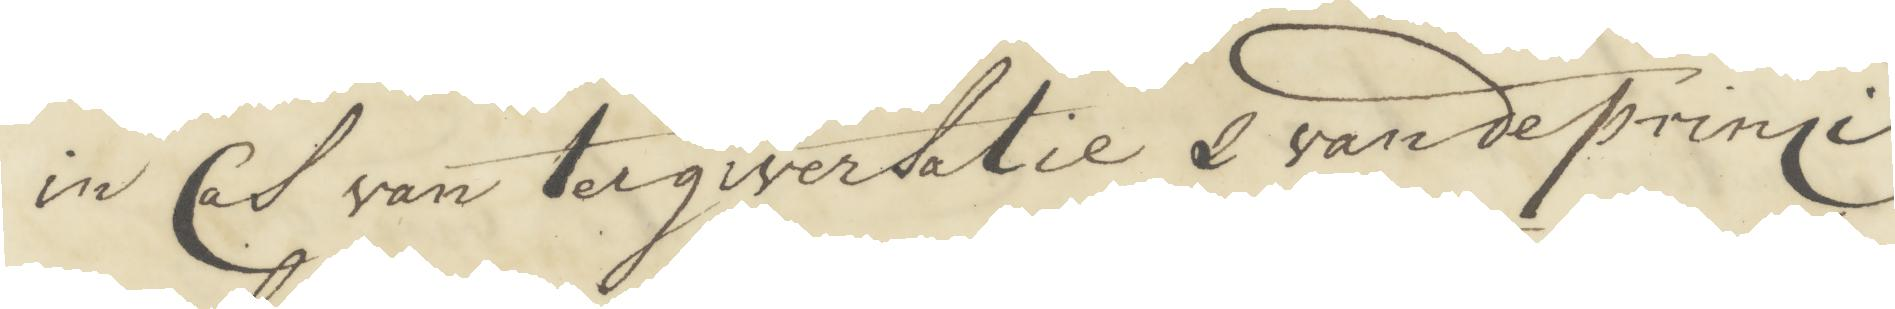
in cas van tergiversatie 2 van de princi
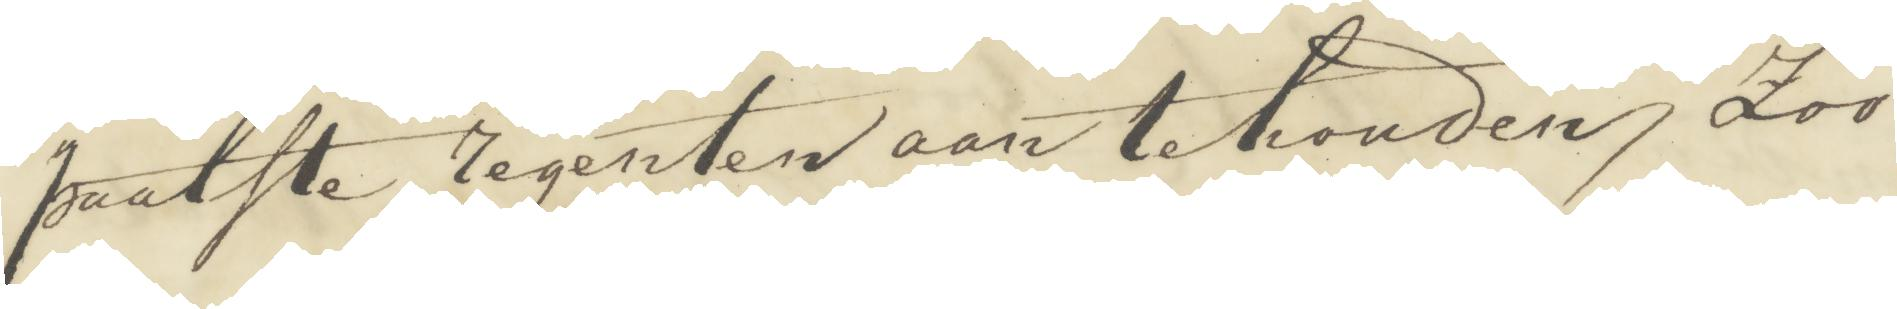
paalste regenten aan tehouden zoo
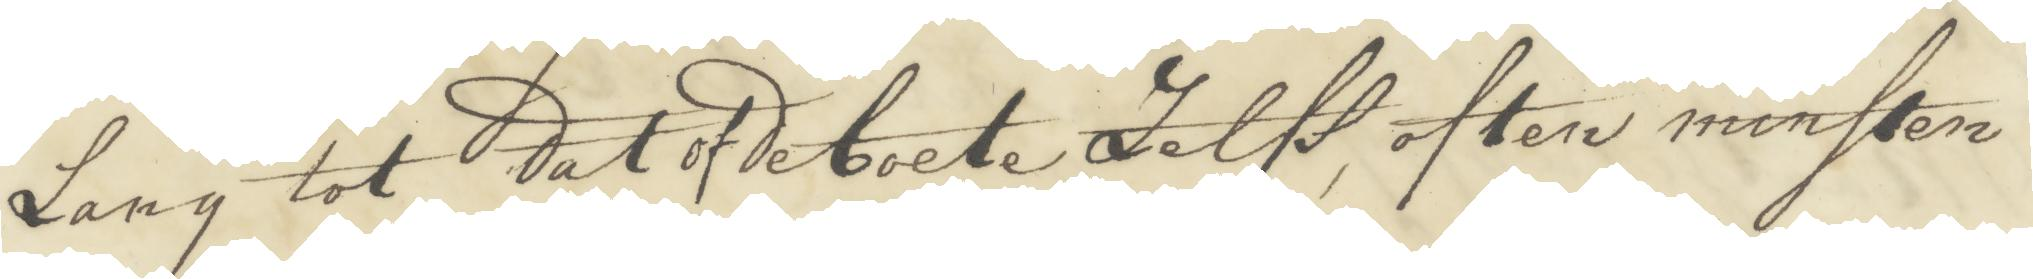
Lang tot dat of de boete zelfs, often minsten
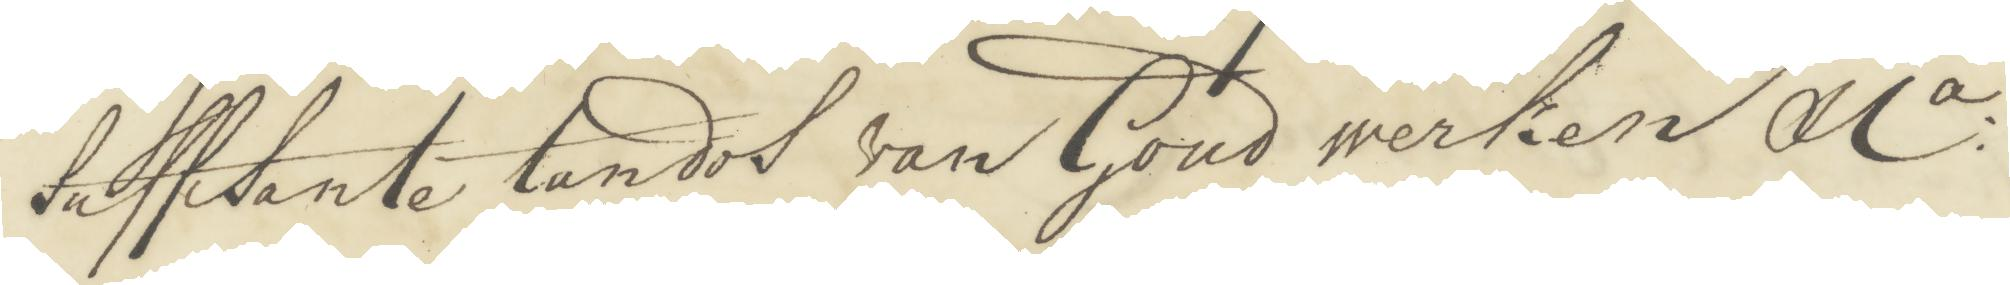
sufffisante tandos van Goud werken EC:a
